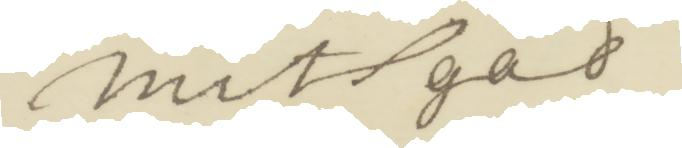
mitsgad
